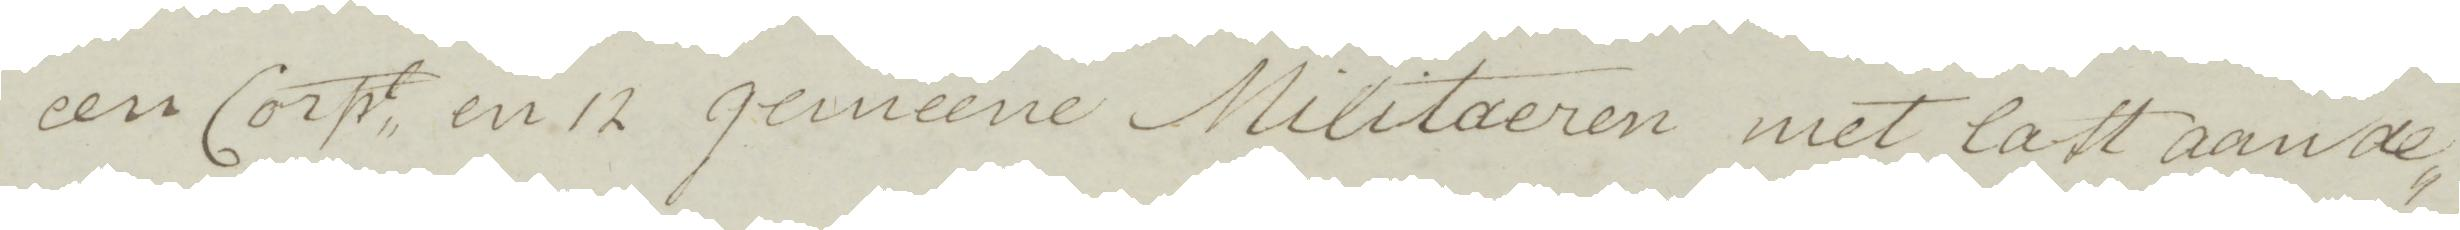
een Corp„t en 12 gemeene Militaeren met last aan de„
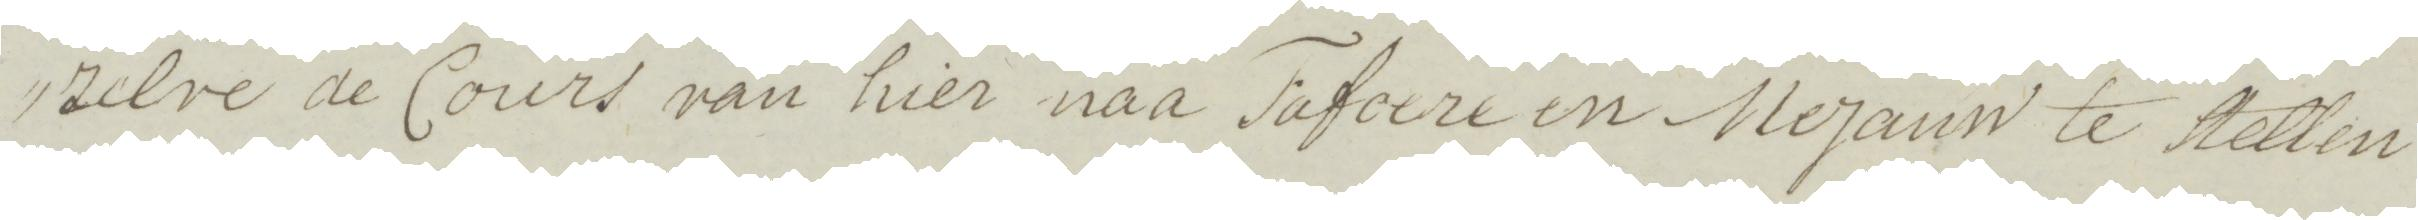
„zelve de Cours van hier naa Tafoere en Mejauw te stellen
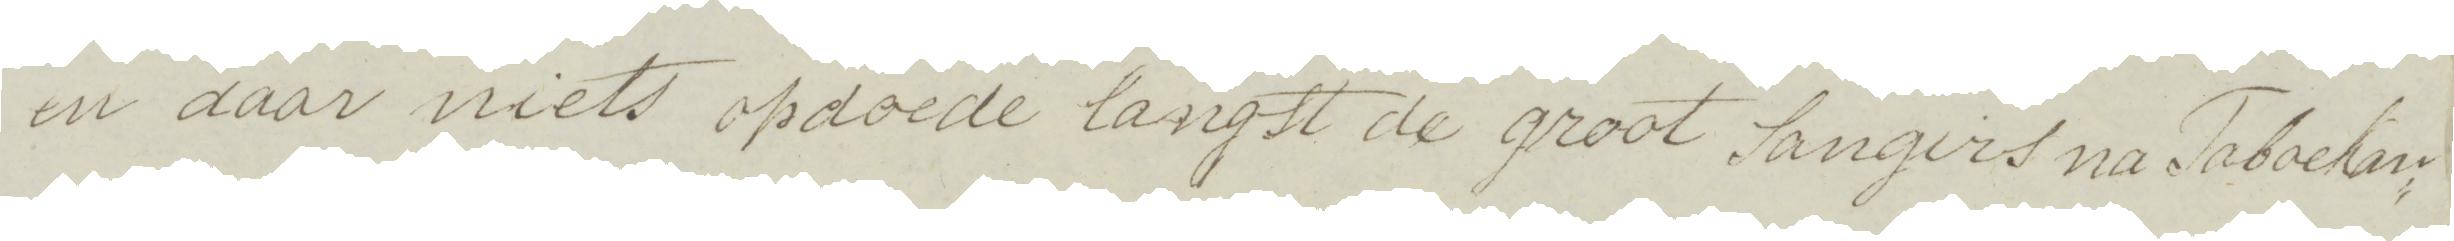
en daar niets opdoede langst de groot sangirs na Taboekan„
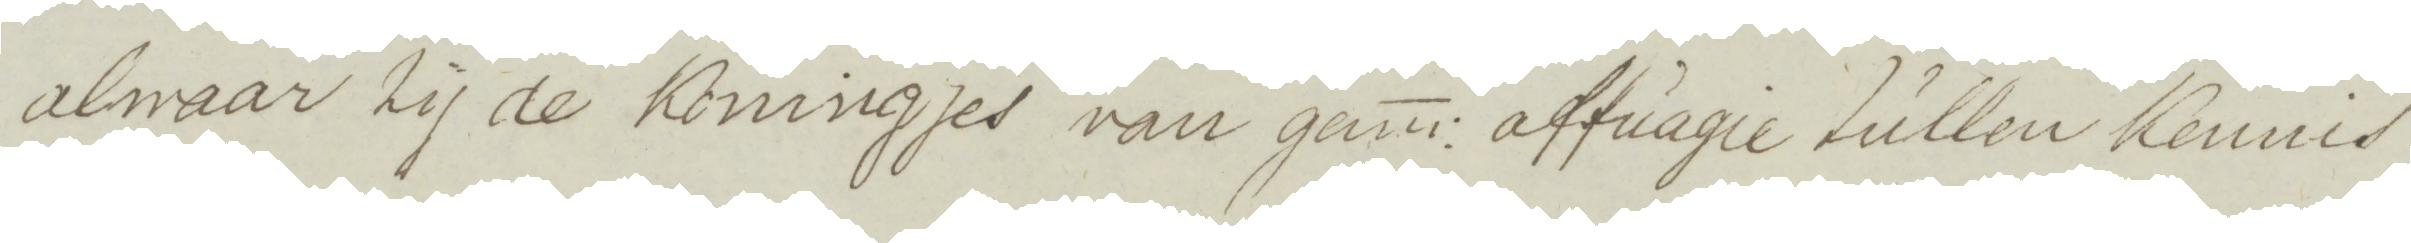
alwaar zij de koningjes van gem: affuagie zullen kennis
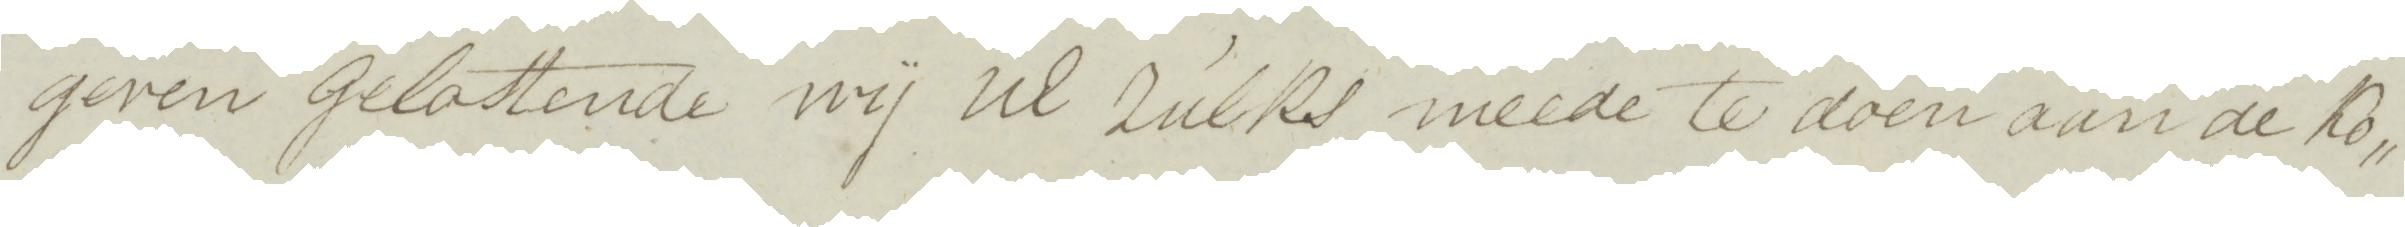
geven gelastende wij UE zulks meede te doen aan de ko„
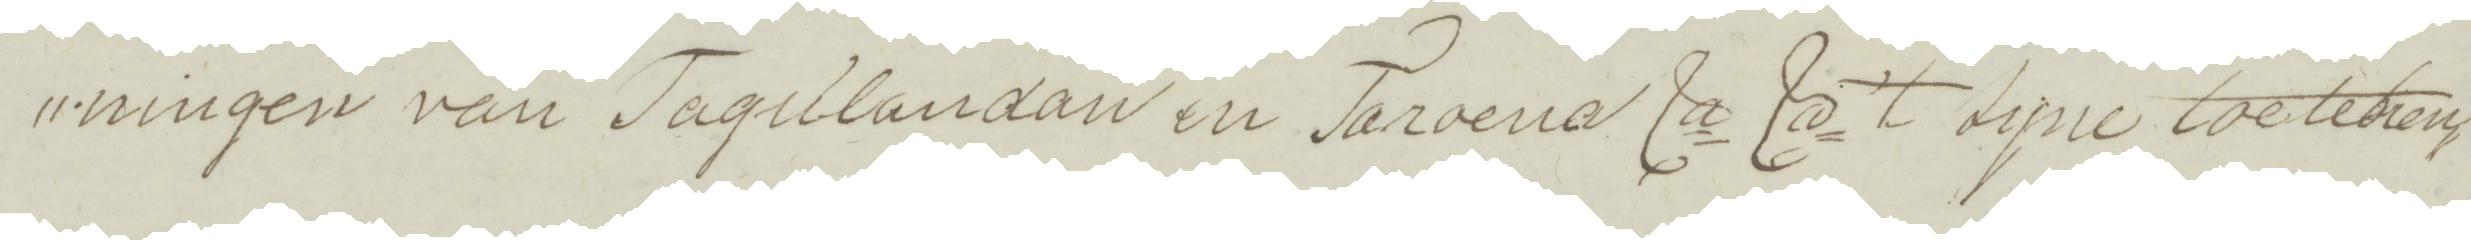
„ningen van Tagulandan en Taroena et=a et=a 't zijne toetebren„
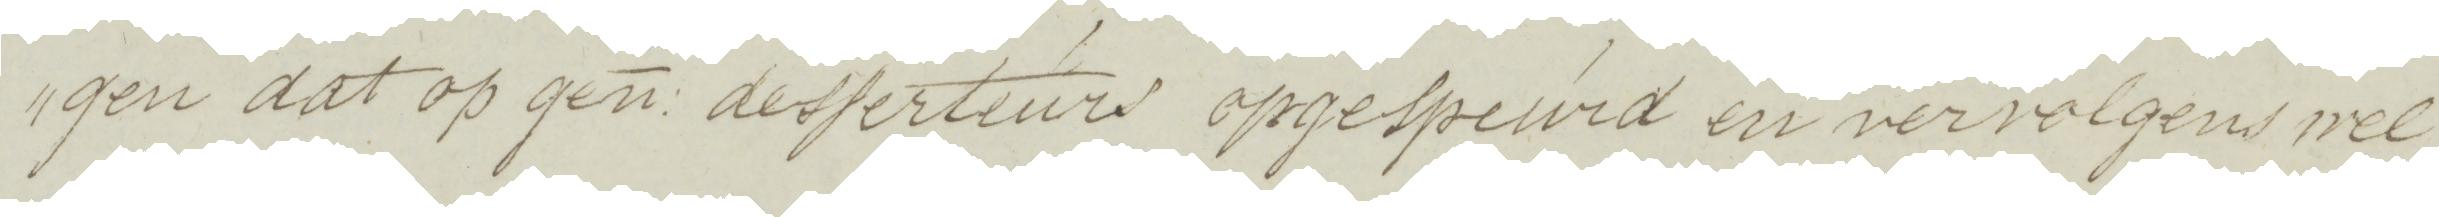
„gen dat op gen: desserteurs opgespeurd en vervolgens wel
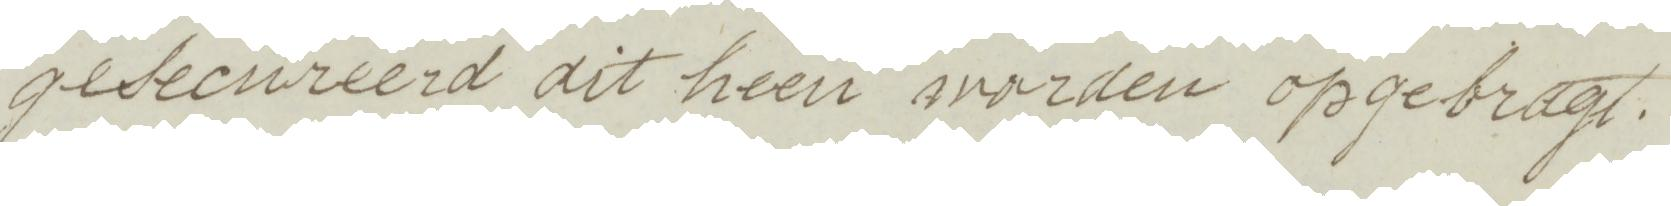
gesecureerd dit heen worden opgebragt.
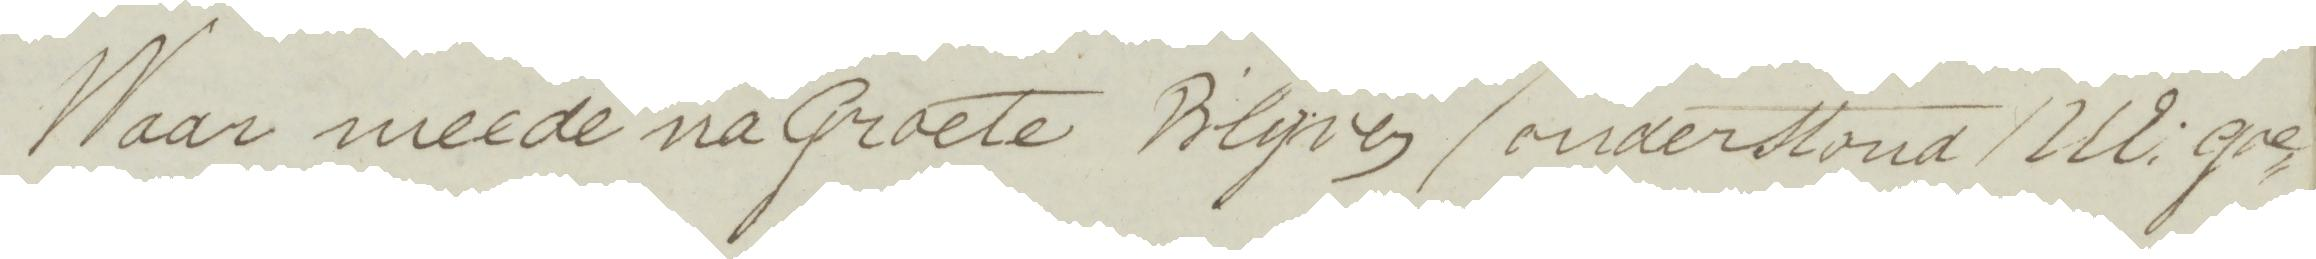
Waar meede na Groete Blijven (onderstond / UE: goe„
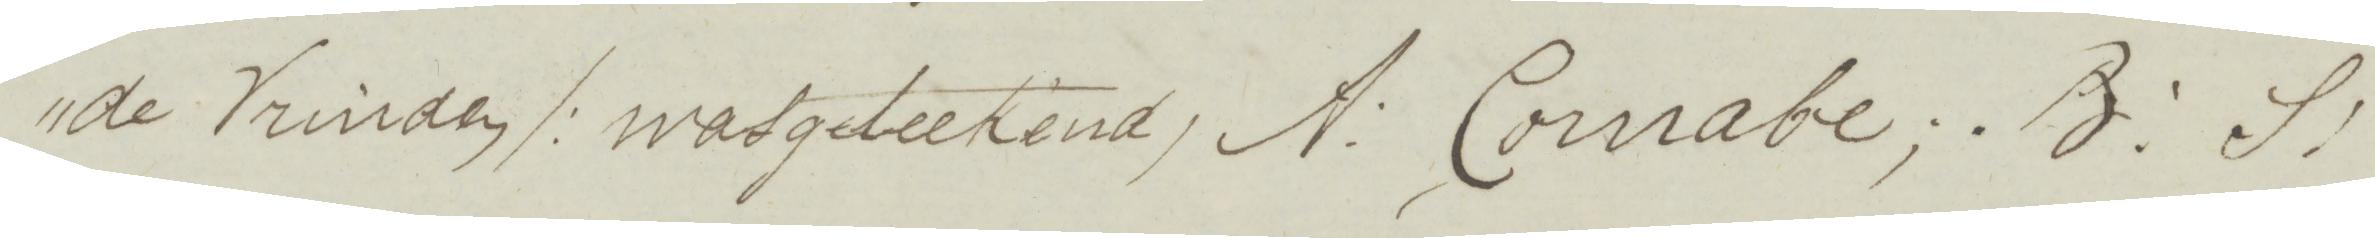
„de Vrinden /: wasgeteekend, A: Cornabe;. B: S:
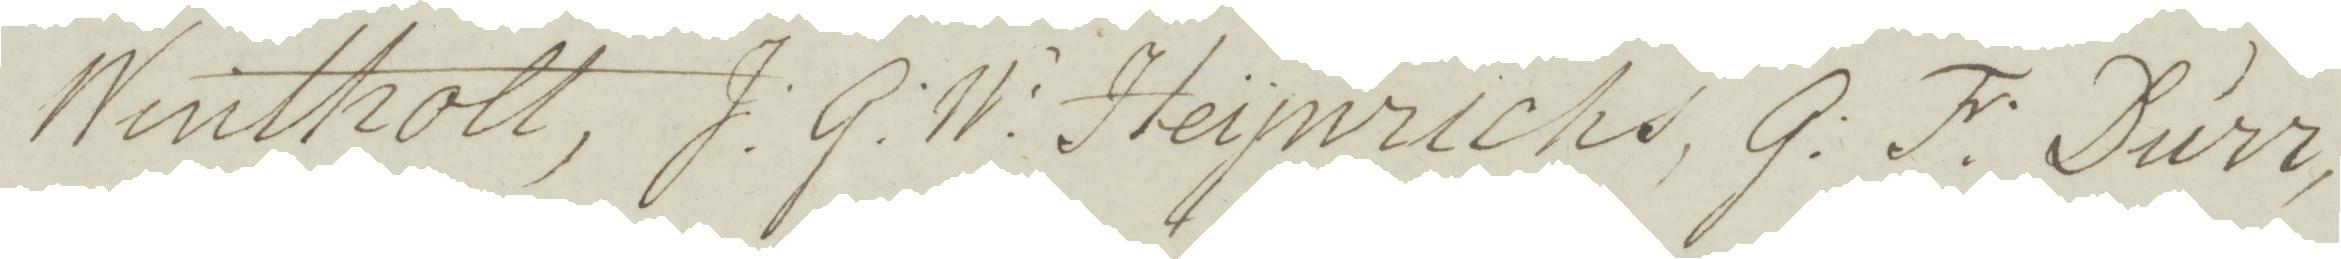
Wintholt, J: G: W: Heijnrichs, G: F: Durr,
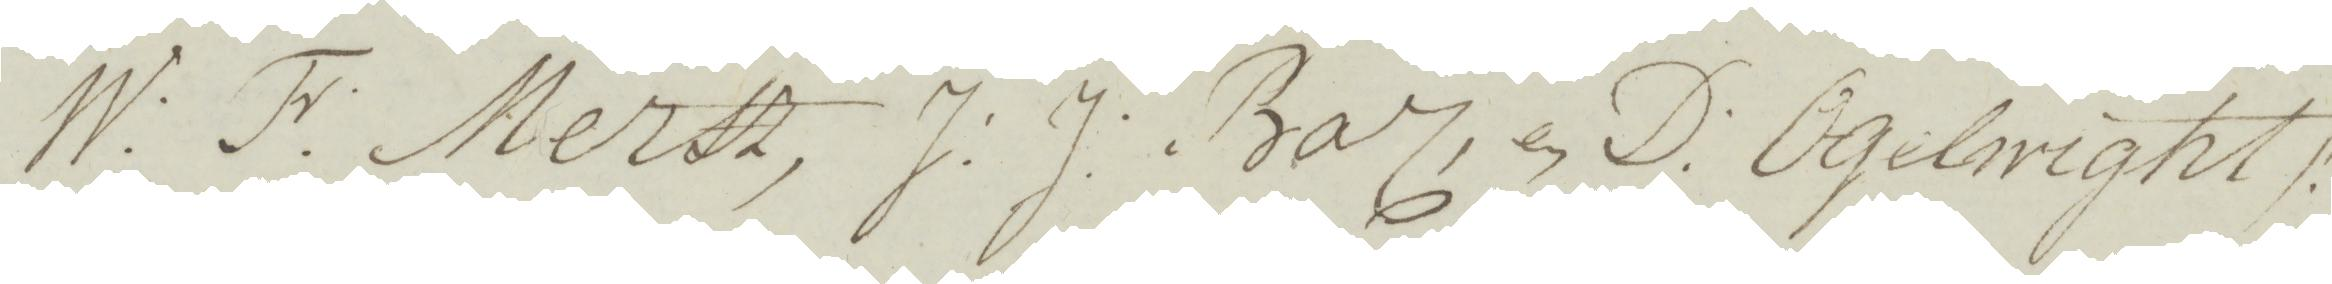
W: F: Mersz, J: J: Bay en D: Ogelwight/:
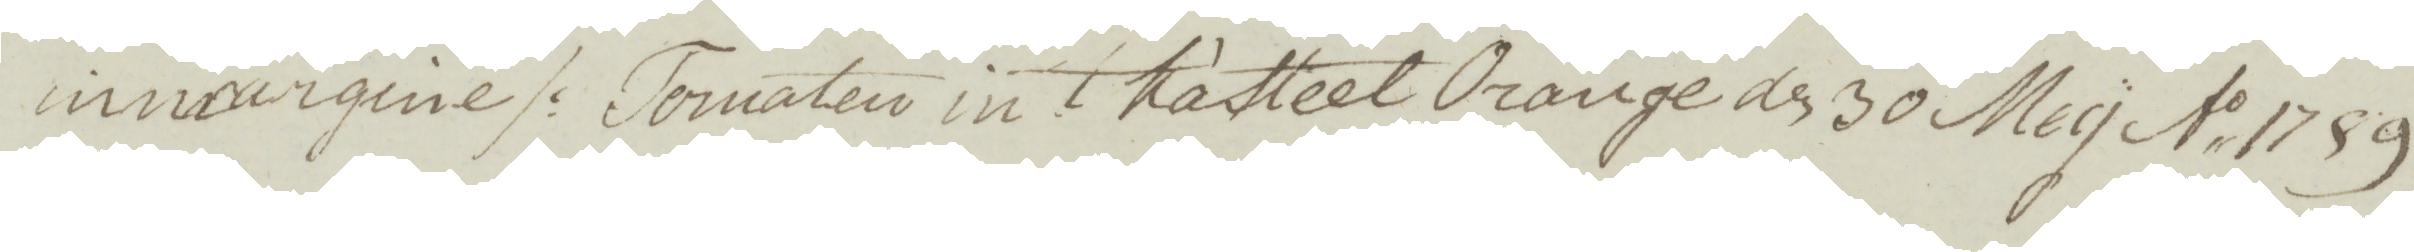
inmargine /: Ternaten in ’t kasteel Orange den 30 Meij A„o 1789
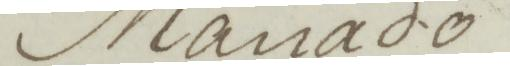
Manado
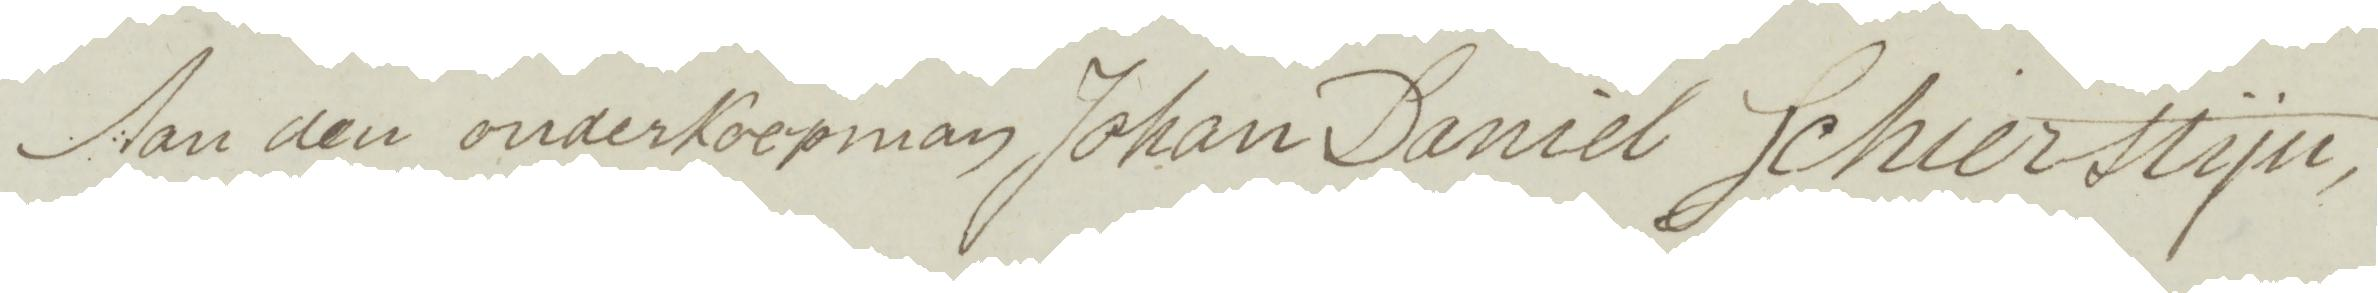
Aan den onderkoepman Johan Daniel Schierstijn,
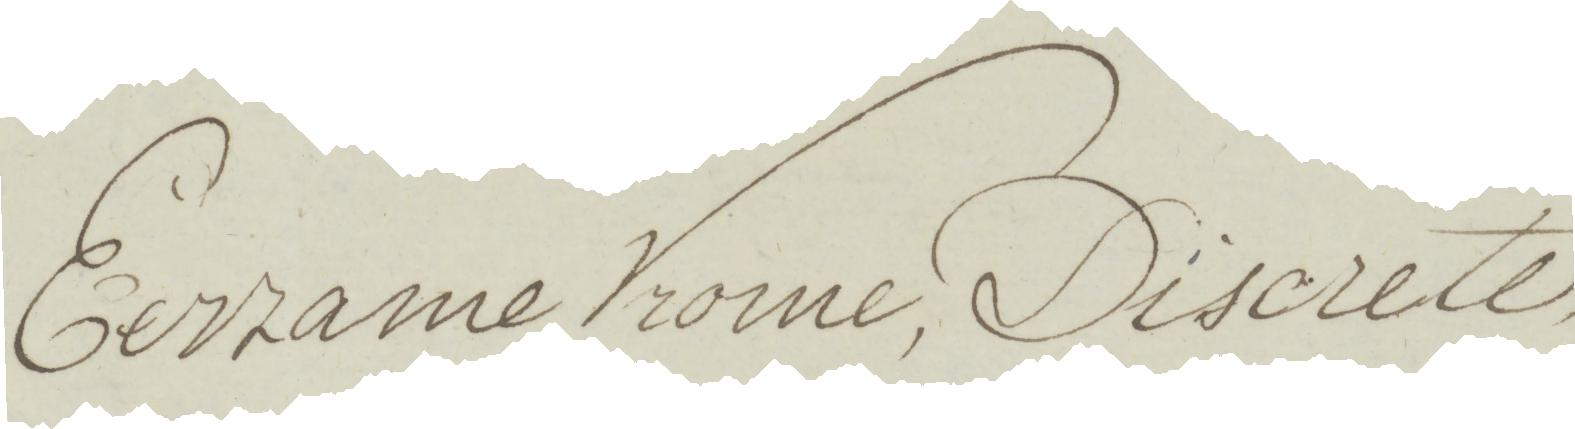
Eerzame, Vrome, Discrete
